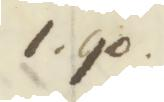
1.90.
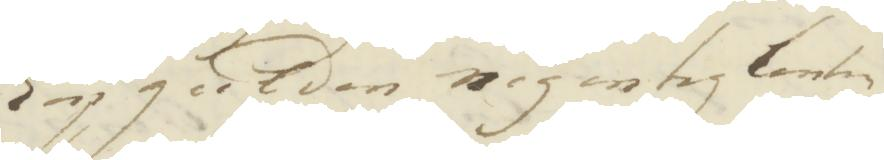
Een gulden negentig Cent
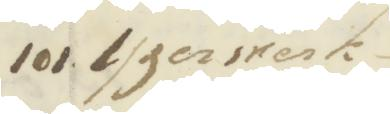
101 4 IJzerwerk
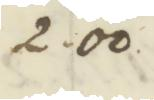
2:00.
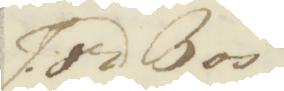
J. der Bos
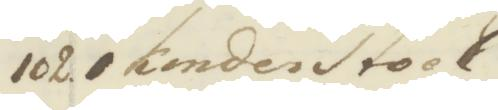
102 1 kinderstoel
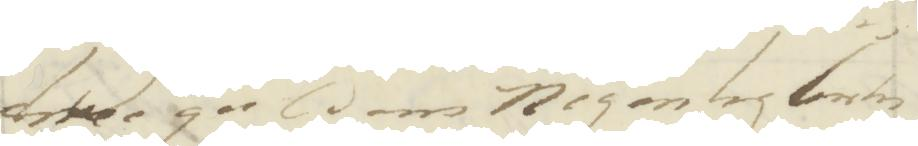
twee gulden Negentig Cent
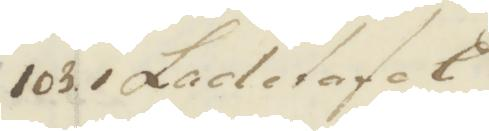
103.1 Lade tafel
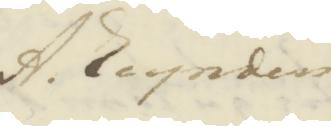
A. Eeynden
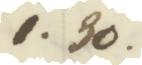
1. 30.
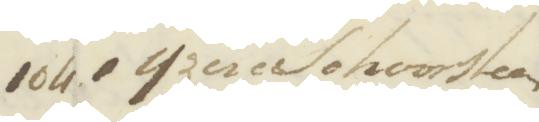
1040 1 IJzere Schoorsteen
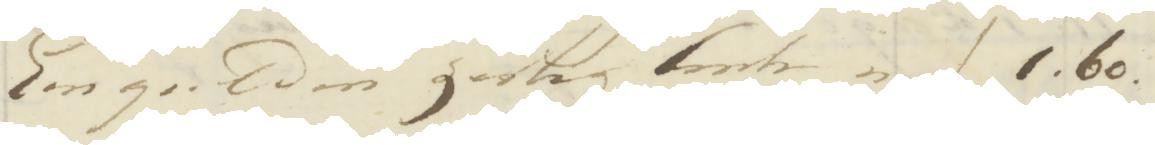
Een gulden zestig Cent ƒ 1:60.
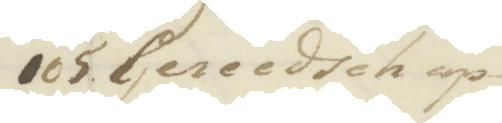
105 Gereedschap
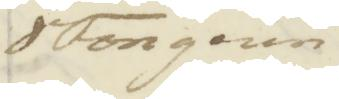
V Tongeren
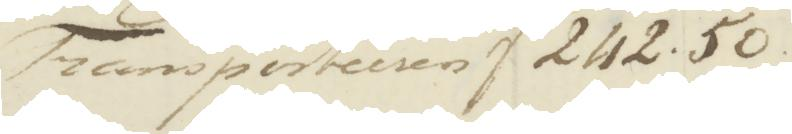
Transporteeren ƒ 242:50.
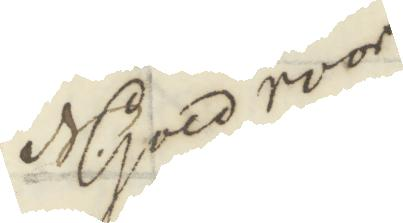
Goed voor
